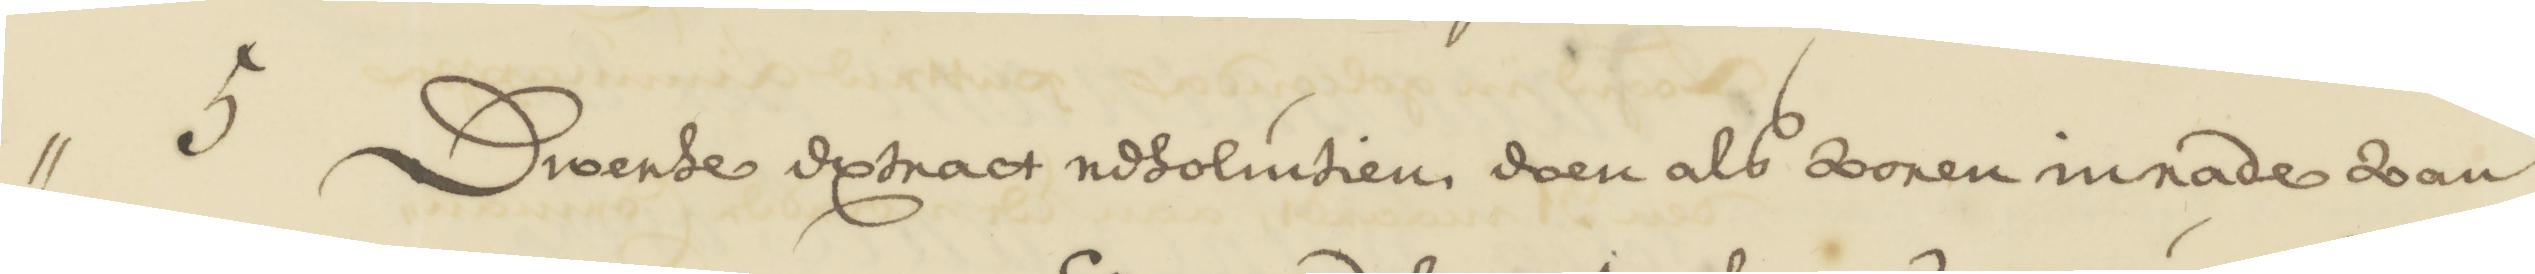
„ 5 Diverse extract resoluitien, even als voren inrade van
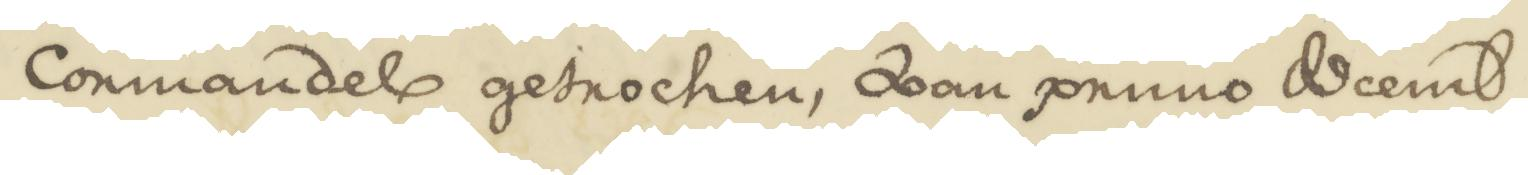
Cormandel getrocken, van primo decemb
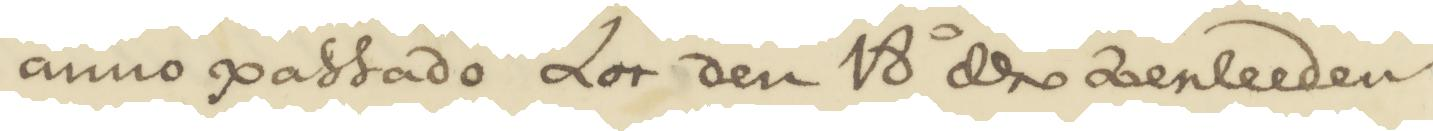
anno passado tot den 18' der verleeden
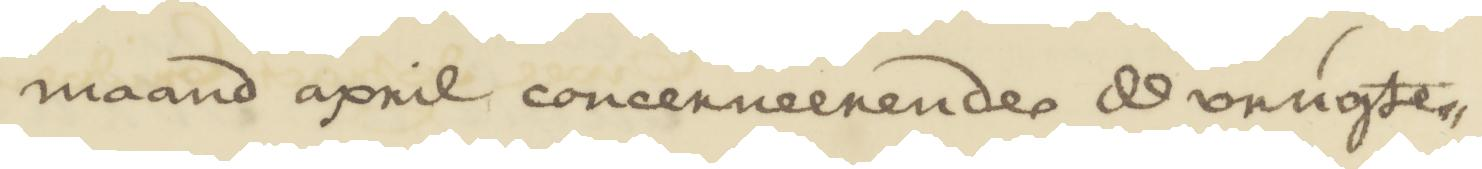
maand april concerneerende de vrugte„
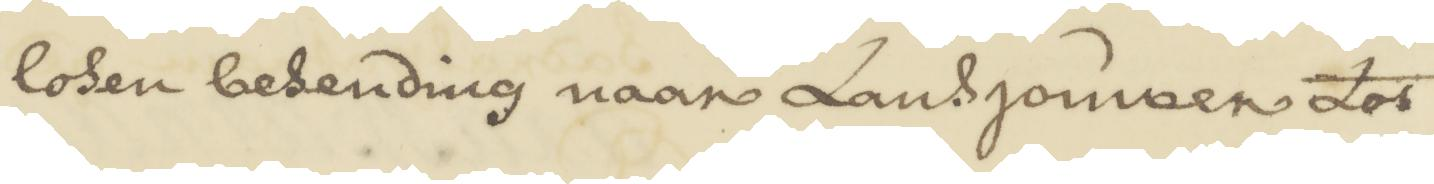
losen besending naar Lanspuwer tot
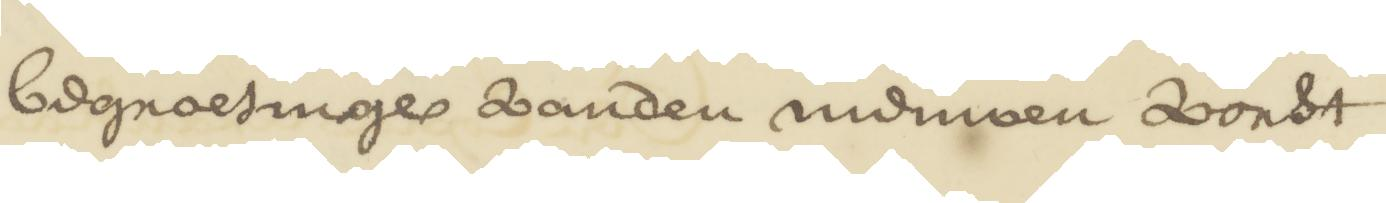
begroetinge vanden nieuwen vorst
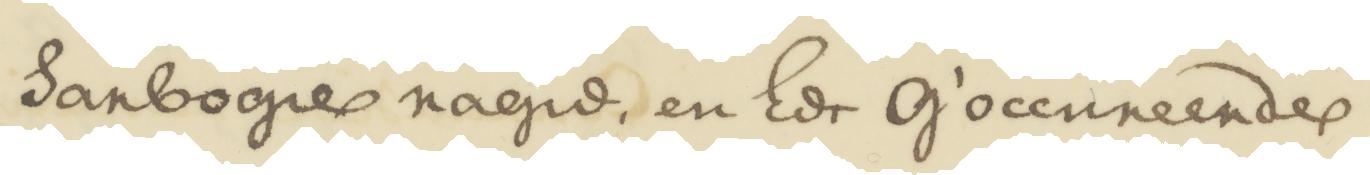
sarbogie ragie, en het g'occureerde
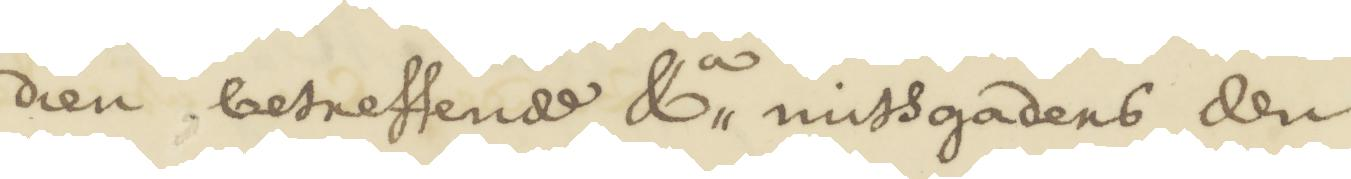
dien betreffende Et„a mitsgaders den
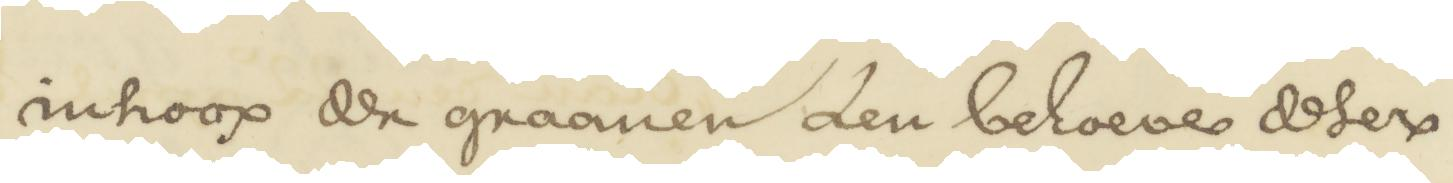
inkoop der graanen ten behoeve deser
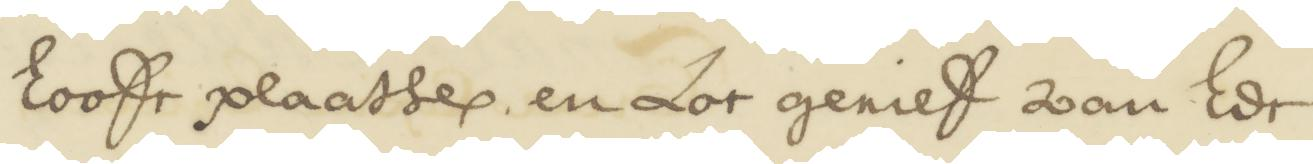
hooft plaatse en tot gerief van het
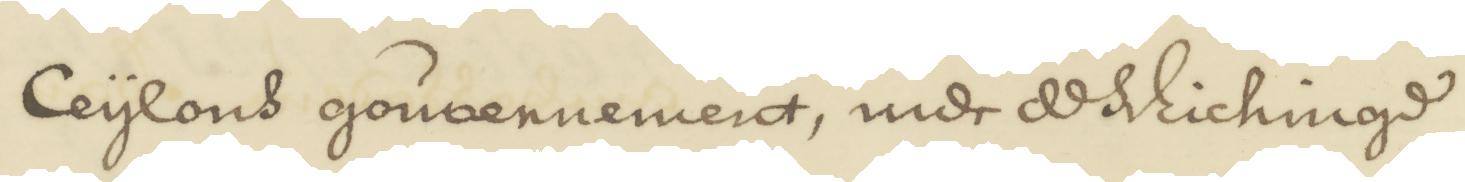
Ceijlons gouvernement, met deschickinge
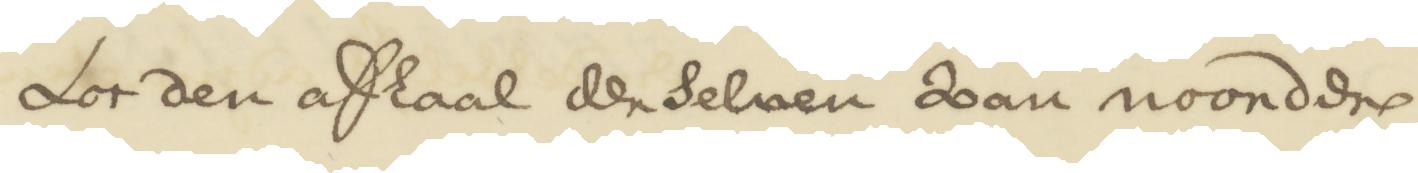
tot den afhaal derselven van noorder
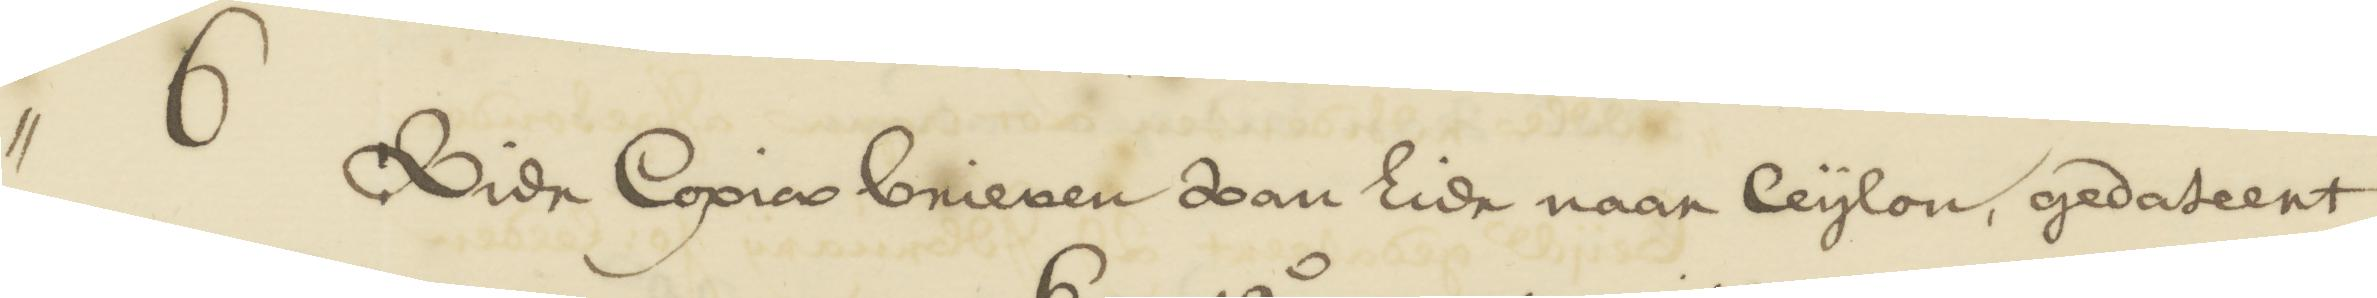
„ 6 Vier Copia brieven van hier naar Ceijlon, gedateert
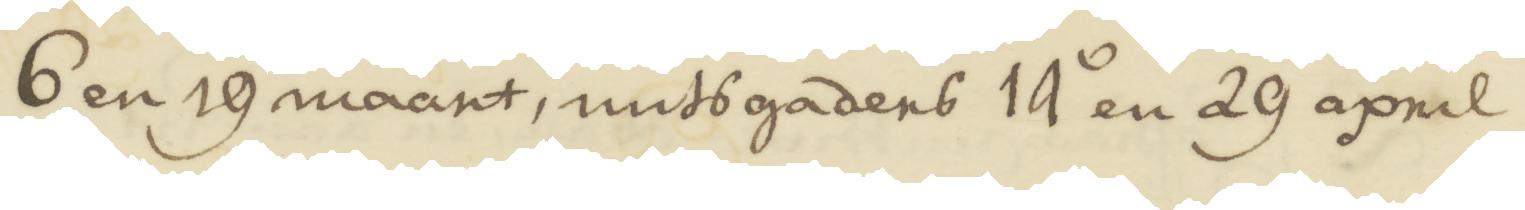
6 en 19' maart, mitsgaders 14' en 29 april
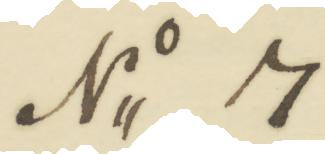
N„o 7
